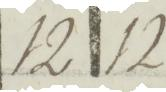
12 12
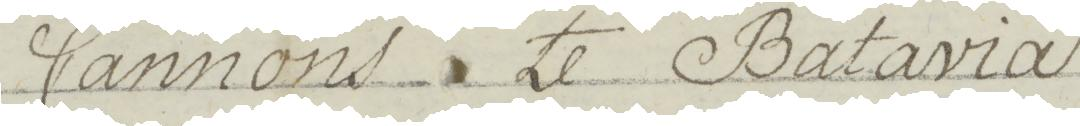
Cannons te Batavia
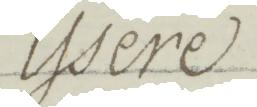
Ysere
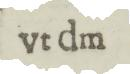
vt dm
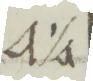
4 ¼
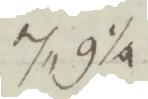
7„ 9¼
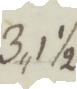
3„1½
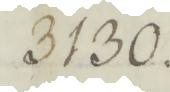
3130.
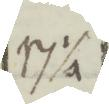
17¼
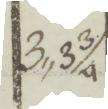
3„3¾
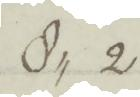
8„ 2
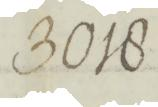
3018
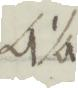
4¼
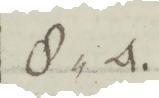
8„ 4.
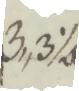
3„3¼
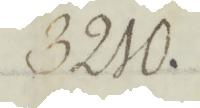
3210.
